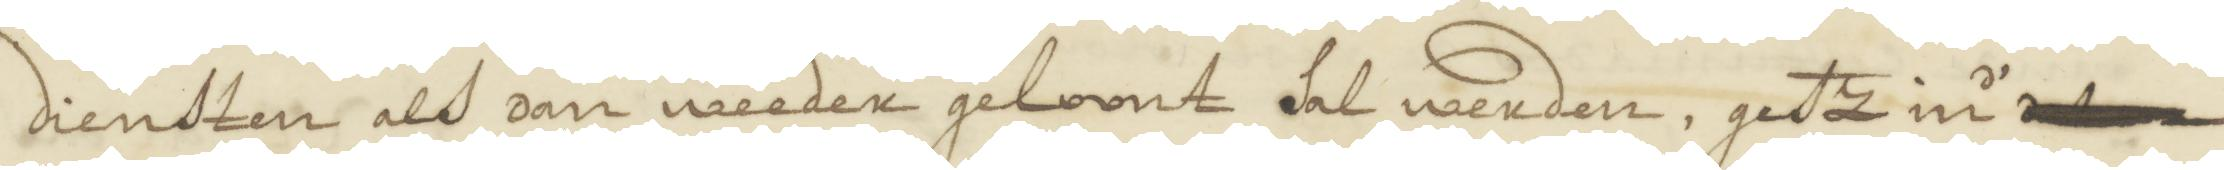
diensten als dan weeder geloont sal werden, gesz in d'
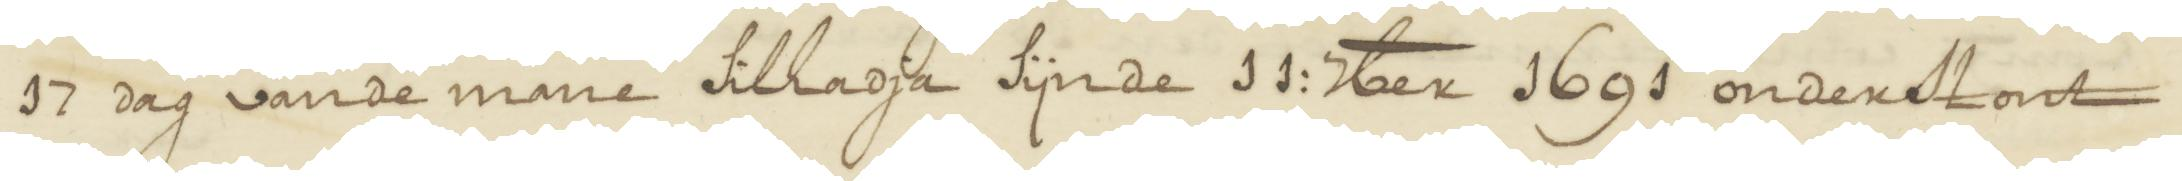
17 dag van de mane Silhadja sijnde 11: 7ber 1691 onderstont
